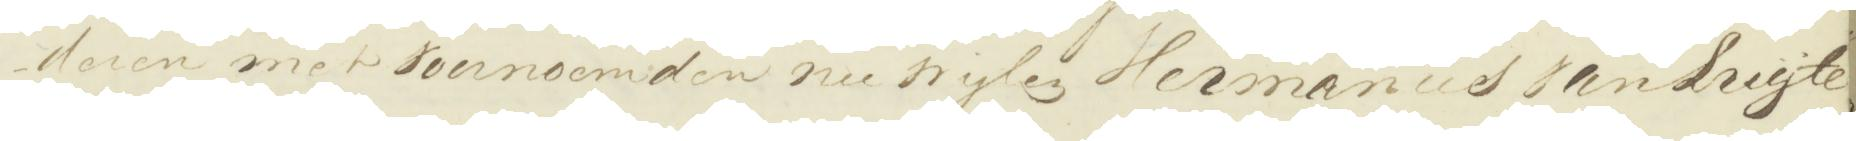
-deren met voernoemden nu wijlen Hermanus van Luijte
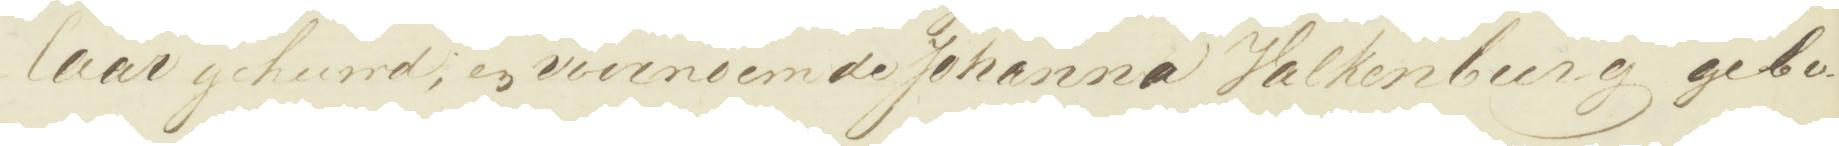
laar gehuwd; en voornoemde Johanna Valkenburg gebo
